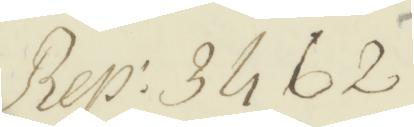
Rep: 3462
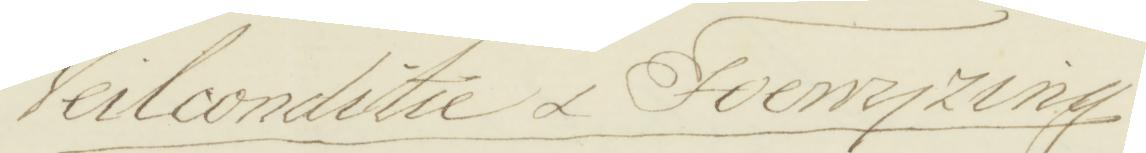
Veilconditie & Toewyzing
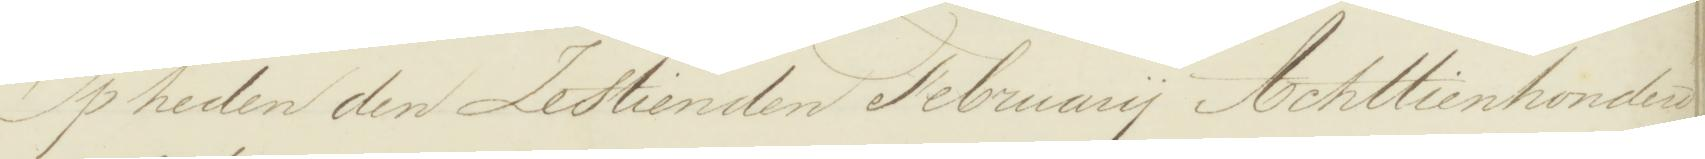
Op heden den Zestienden Februarij Achttienhonderd
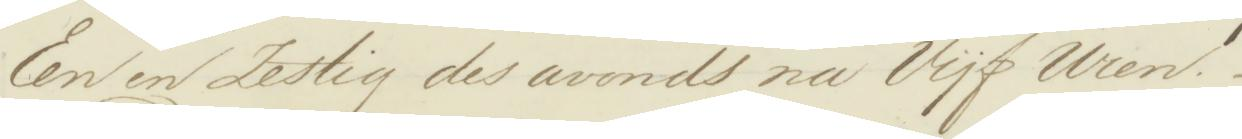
Een en Zestig des avonds na Vijf Uren.
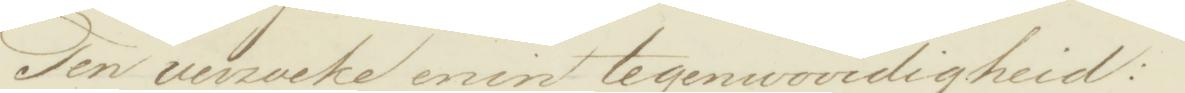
Ten verzoeke en in tegenwoordigheid:
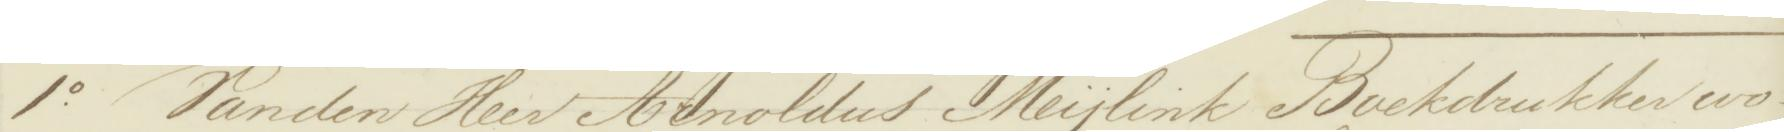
1.º Van den Heer Arnoldus Meijlink Boekdrukker wo
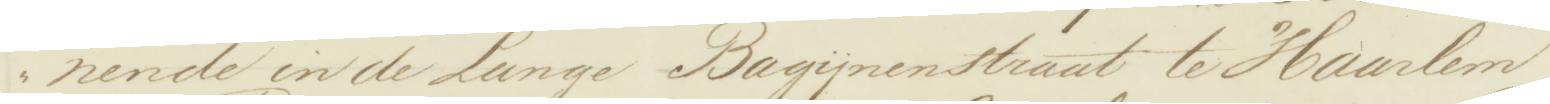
„nende in de Lange Bagijnenstraat te Haarlem
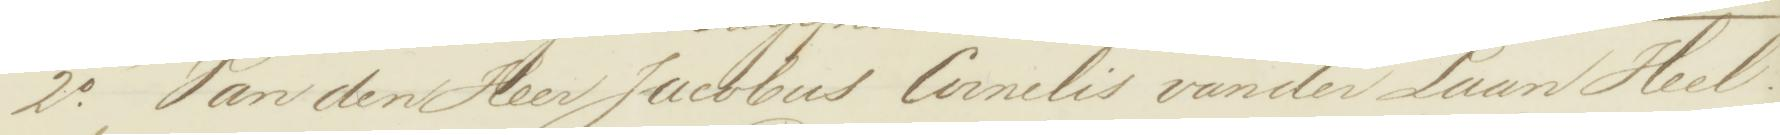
2.º Van den Heer Jacobus Cornelis van der Laan Heel.
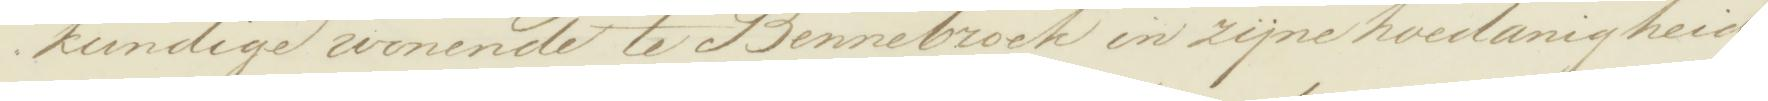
„kundige wonende te Bennebroek in zijne hoedanigheid
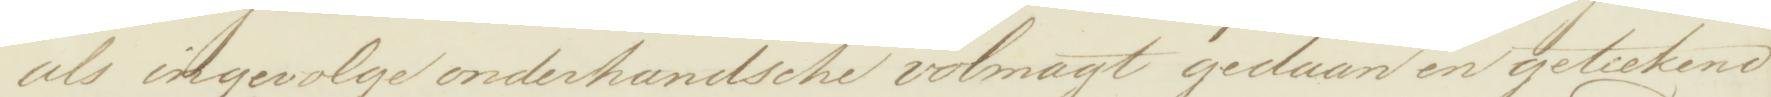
als ingevolge onderhandsche volmagt gedaan en geteekend
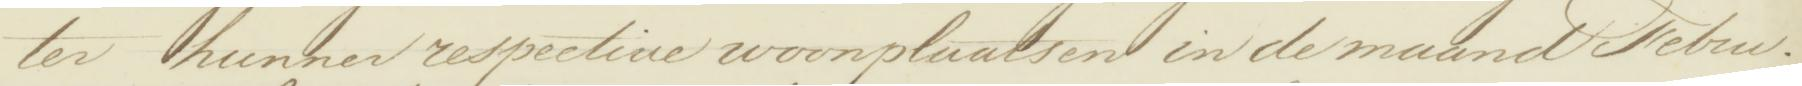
ter hunner respective woonplaatsen in de maand Febru„
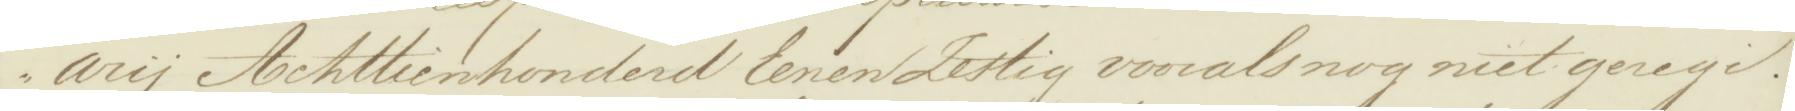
„arij Achttienhonderd Eenen Zestig voor als nog niet geregi„
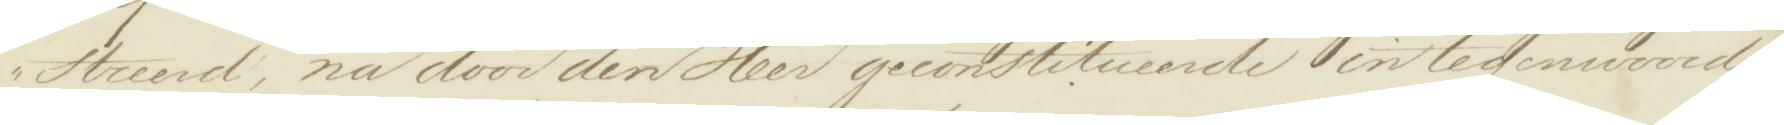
„streerd, na door den Heer geconstitueerde in tegenwoordig
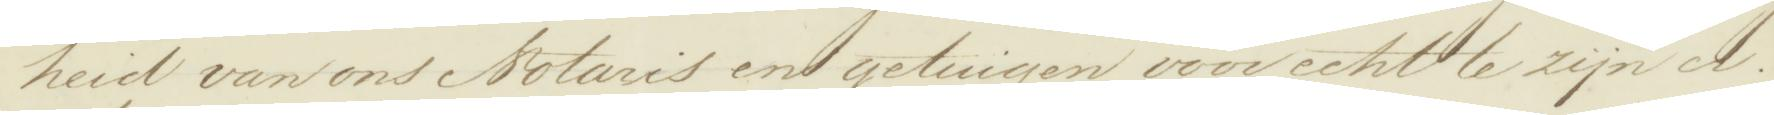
heid van ons Notaris en getuigen voor echt te zijn er„
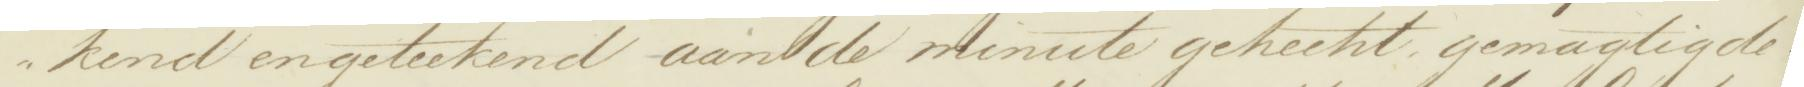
„kend en geteekend aan de minute gehecht, gemagtigde:
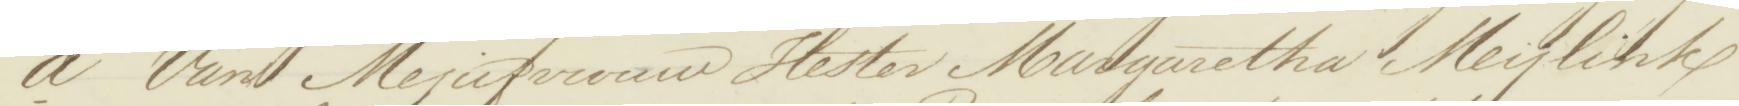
a Van Mejufvrouw Hester Margaretha Meijlink
